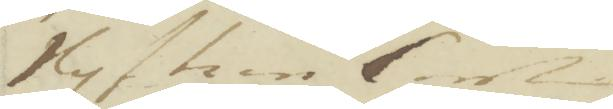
Vyftien Cents
